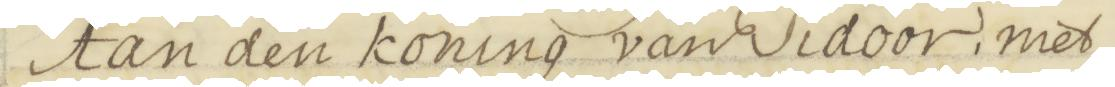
Aan den koning van Tidoor, met
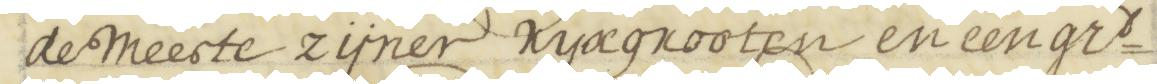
de meeste zijner ryxgrooten en een gr=t
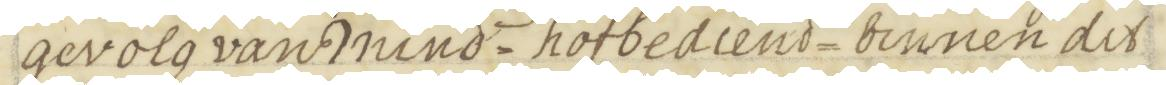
gevolg van mind=e hof bediend=s binnen dit
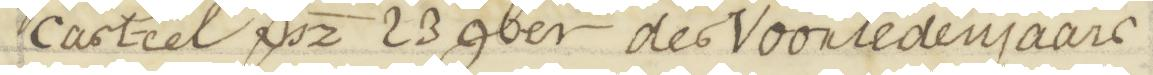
Casteel versz 23 9ber des voorleden jaars
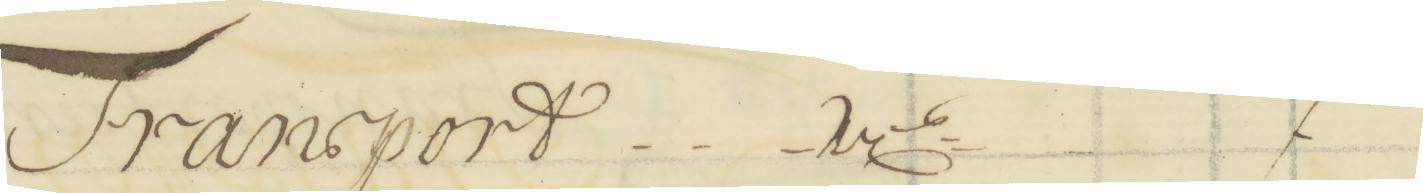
Transport - - - rx=s ƒ
